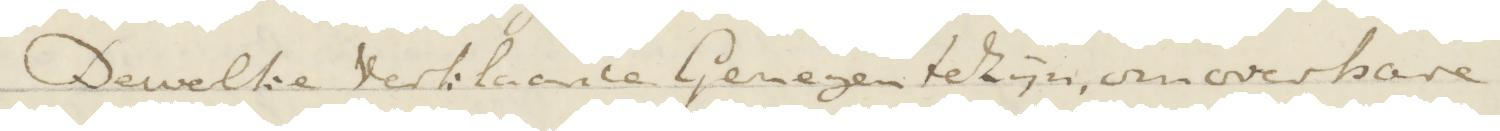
Dewelke verklaarde Genegen te zijn, om over hare
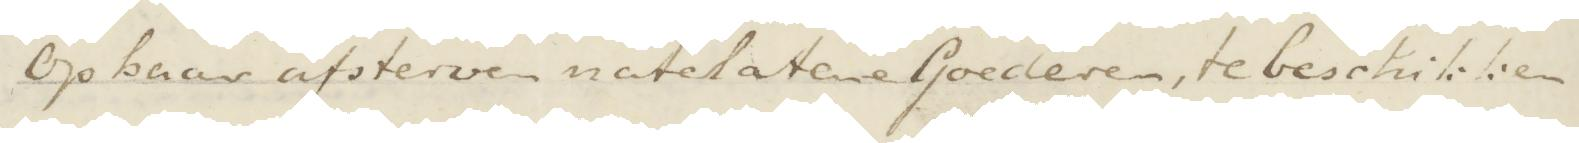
Op haar afsterven natelatene Goederen, te beschikken
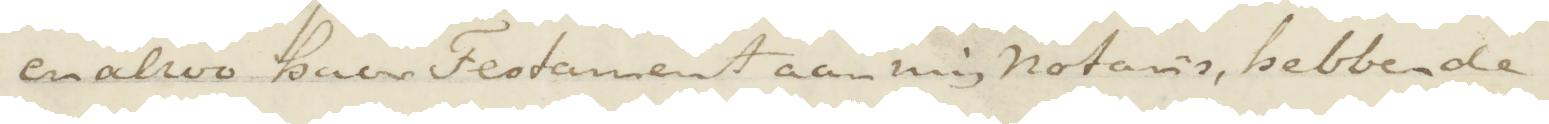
en alzoo haar Testament aan mij notaris, hebbende
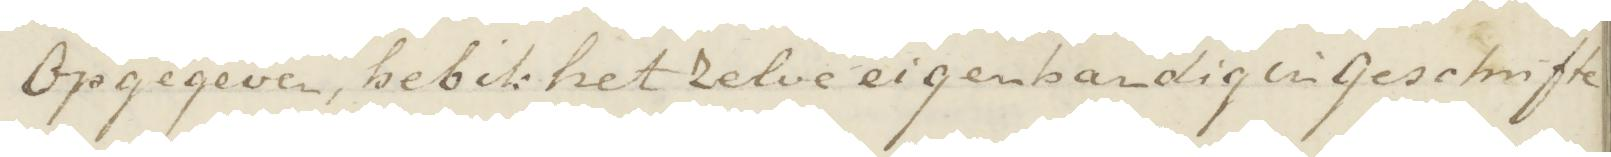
Opgegeven, heb ik het zelve eigenhandig in geschrifte
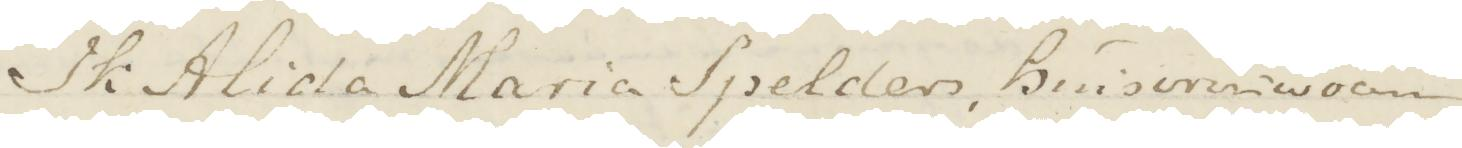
Ik Alida Maria Spelder, huisvrouw van
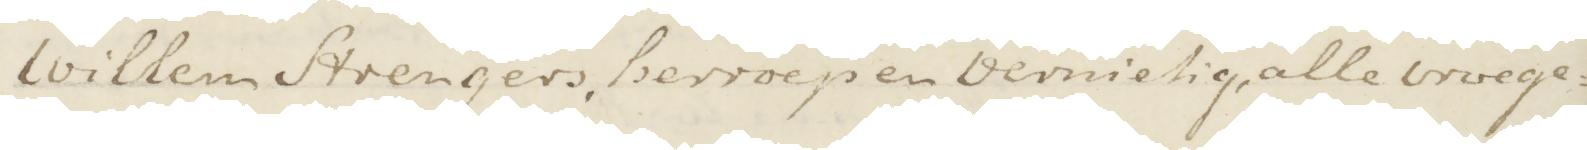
Willem Strengers, herroep en vernietig, alle vroege„
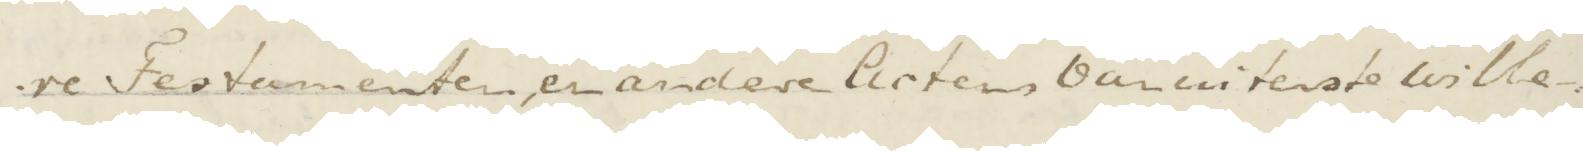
„re Testamenten, en andere Actens van uiterste wille
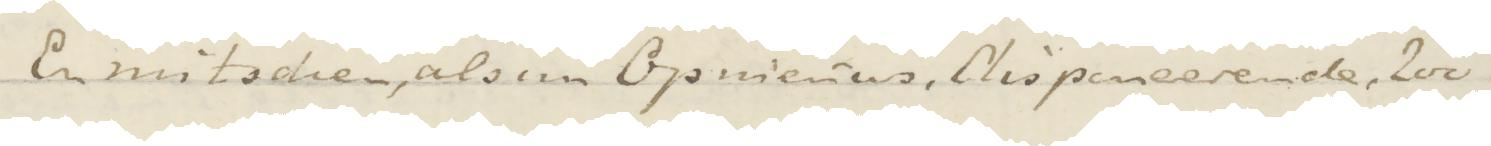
En mitsdien, als nu Opnieuw, disponeerende zoo
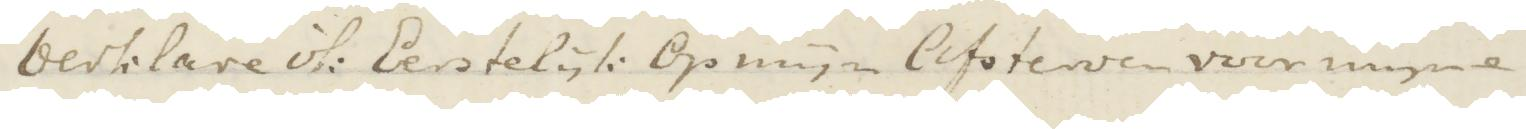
verklare ik Eerstelijk op mijn Afsterven voor myne
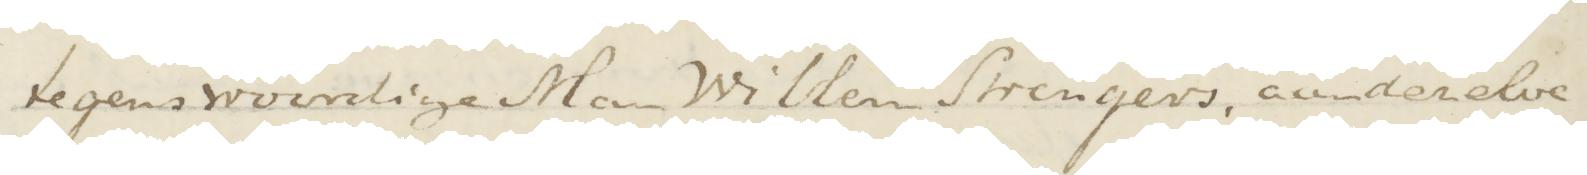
tegenswoordige Man Willem Strengers, aan dezelve
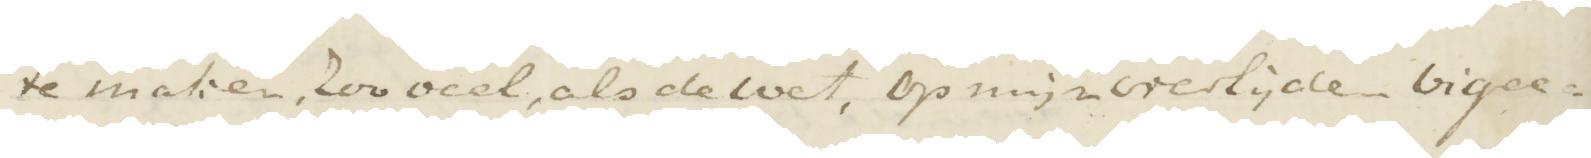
te maken, zoo veel, als de wet, op mijn overlijden vigee=
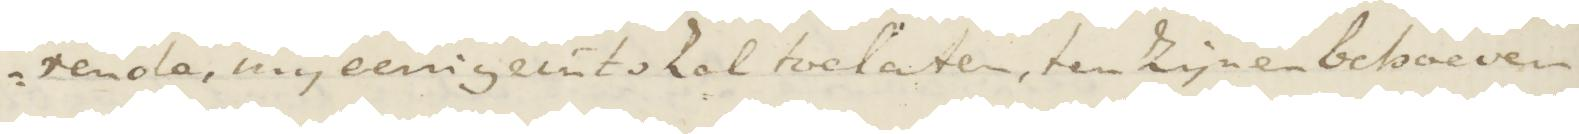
=rende, mij eenigzints zal toelaten, ten zijnen behoeven
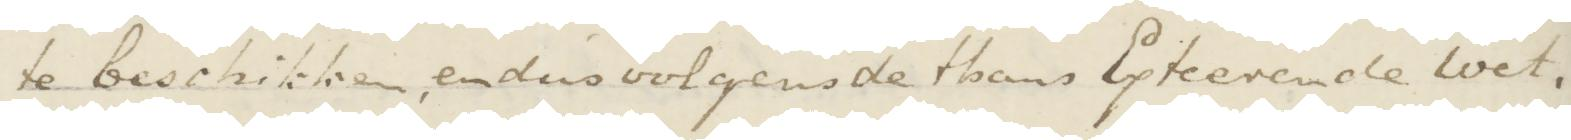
te beschikken, en dus volgens de thans Exteerende wet
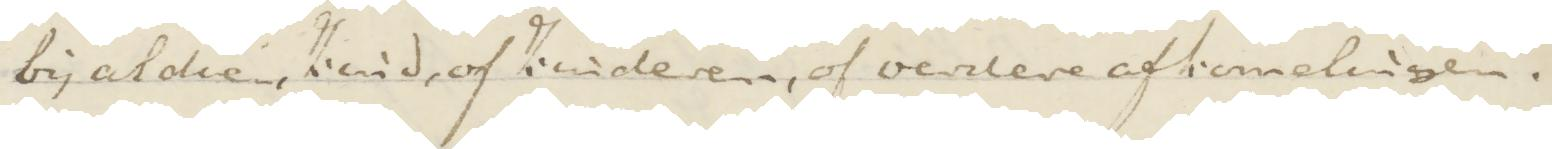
bij aldien kind, of kinderen, of verdere afkomelingen.
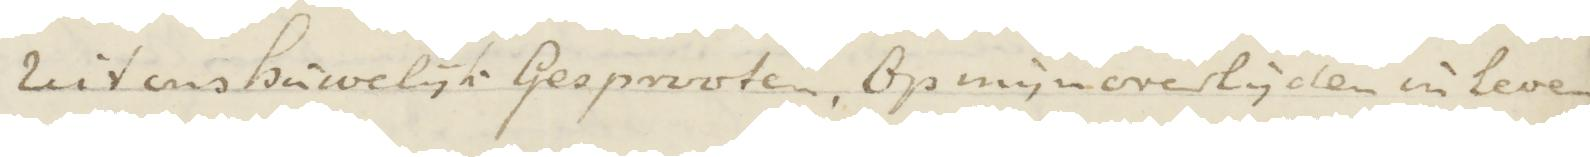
uit ons huwelijk Gesprooten, Op mijn overlijden in leven
